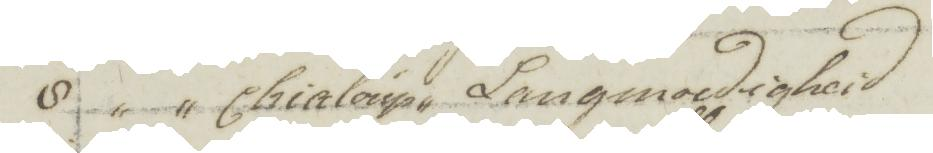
8 „ „ Chialoup Langmoedigheid
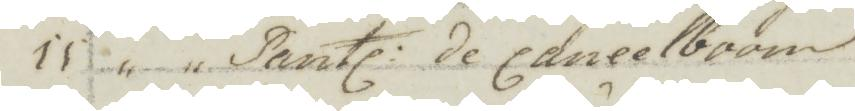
11 „ „ Pant: de caneelboom
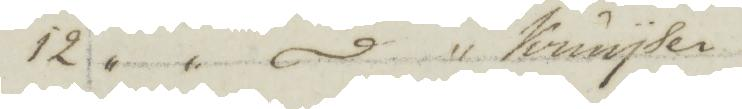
12 „ „ _o „ Kruijser
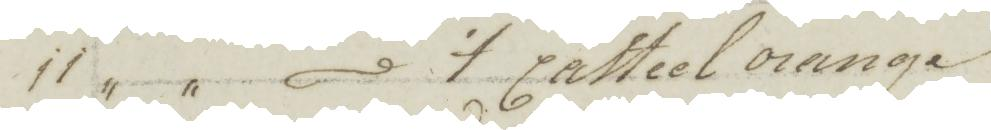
11 „ „ _o 't casteel orange
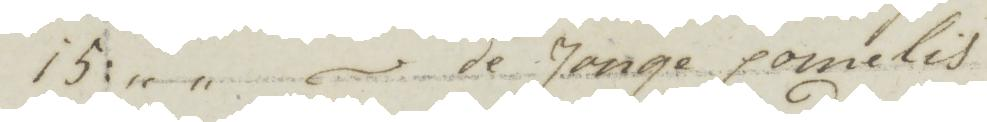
15: „ „ _o de Jonge cornelis
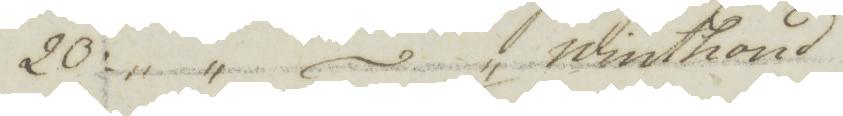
20: „ „ _o „ winthond
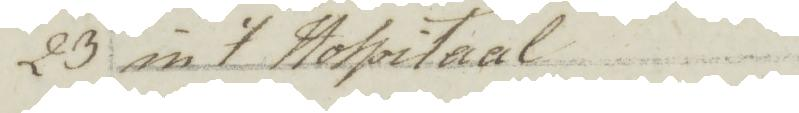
23 in 't Hospitaal
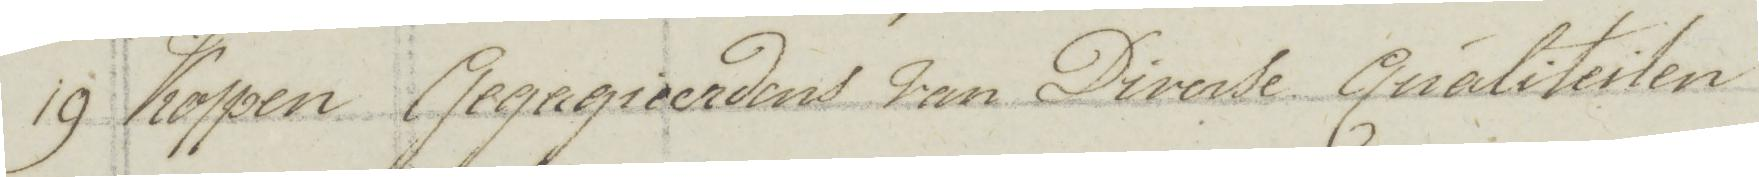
19 koppen Gegagieerdens van Diverse Qualiteiten
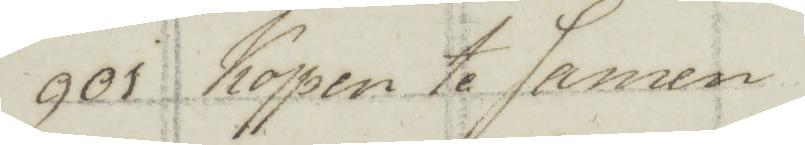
901 Koppen te samen
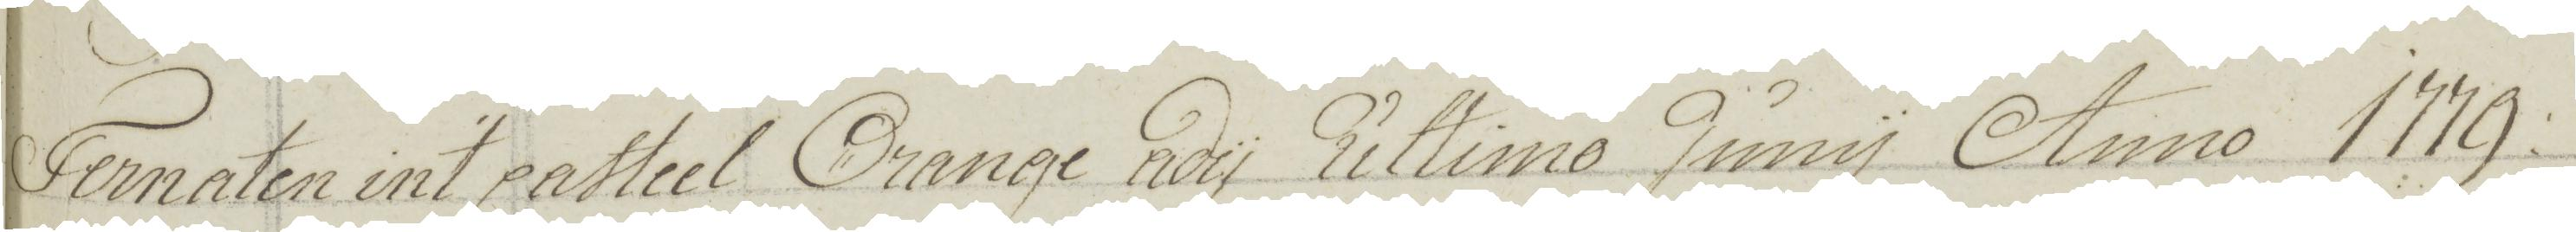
Ternaten in ’t casteel Orange adij ultimo Junij Anno 1779:
